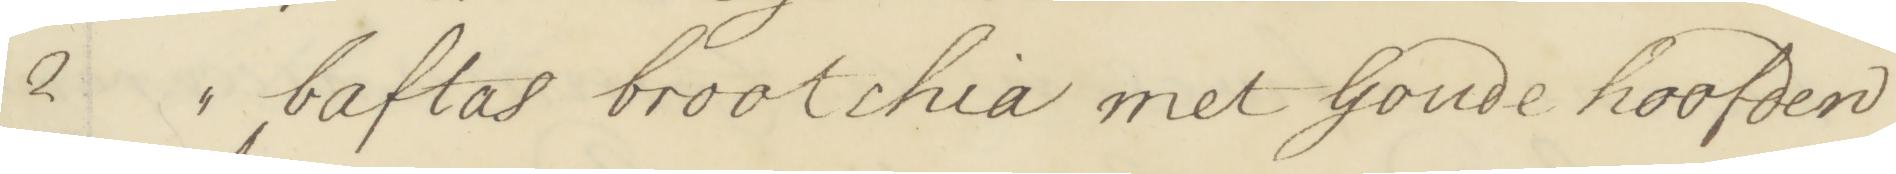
2 „ baftas brootchia met goude hoofden
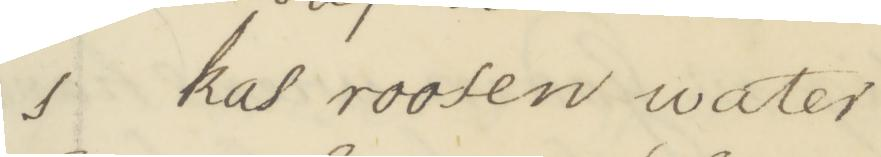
1 kas roosen water
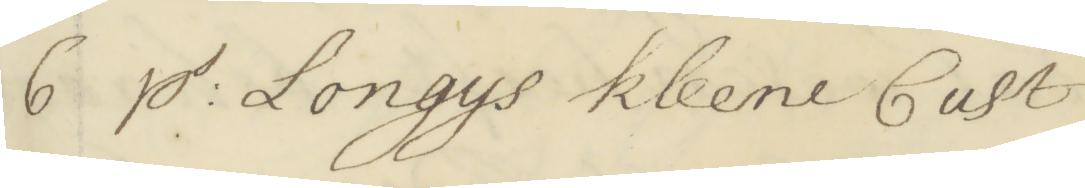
6 p:s Longys kleene Cust
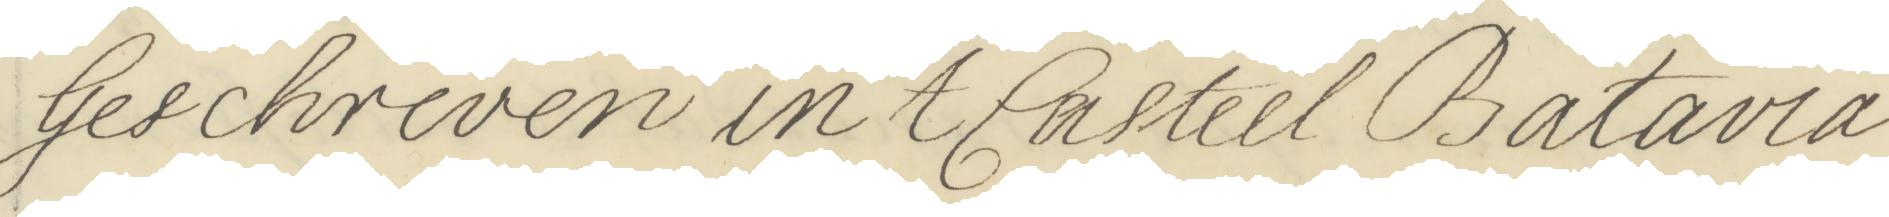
geschreven in ’t Casteel Batavia
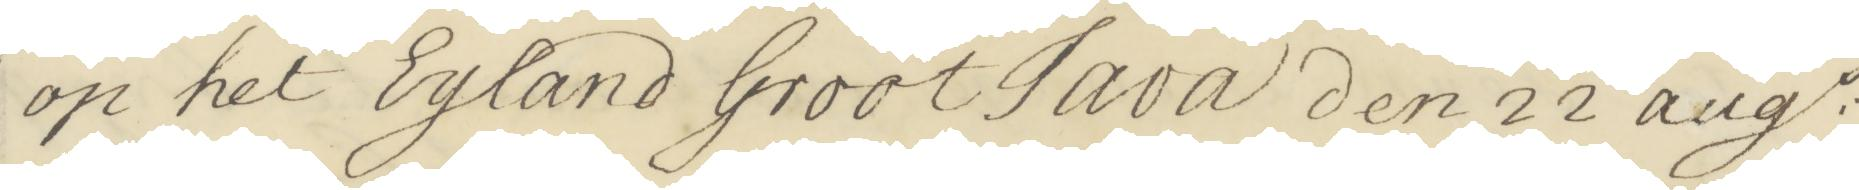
op het Eyland Groot Java den 22 aug:s
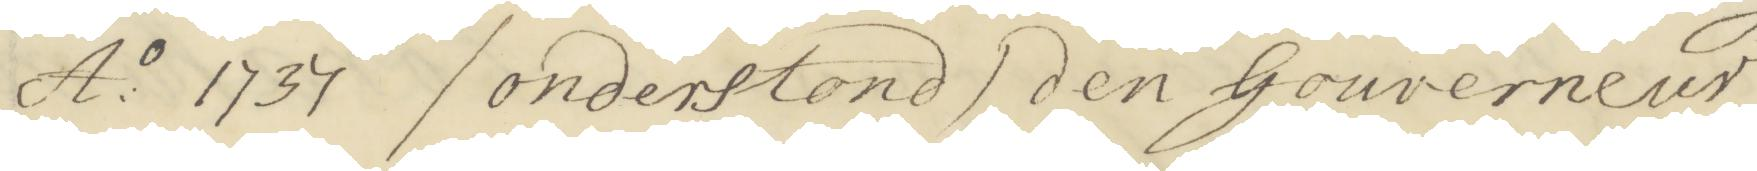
A:o 1757 /onderstond/ den gouverneur
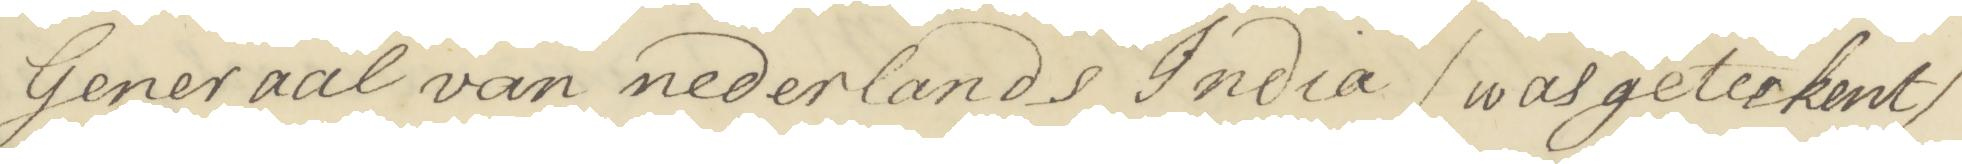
Generaal van nederlands India /was geteekent/
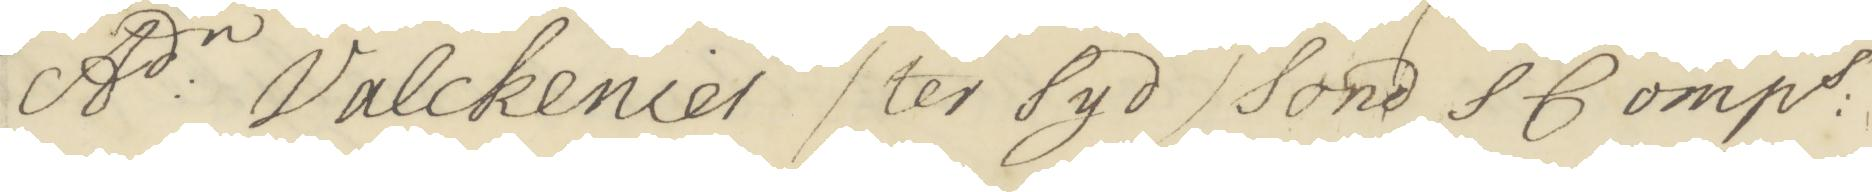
Ad:r Valckenier /ter syd/ sond s Comps:
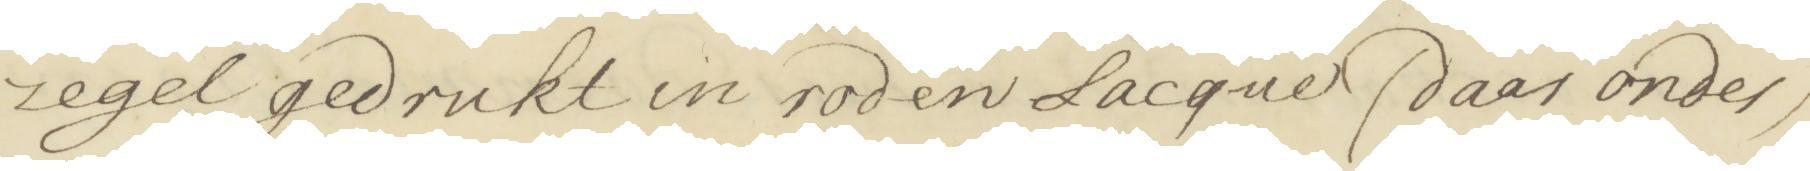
zegel gedrukt in roden lacque /daar onder/
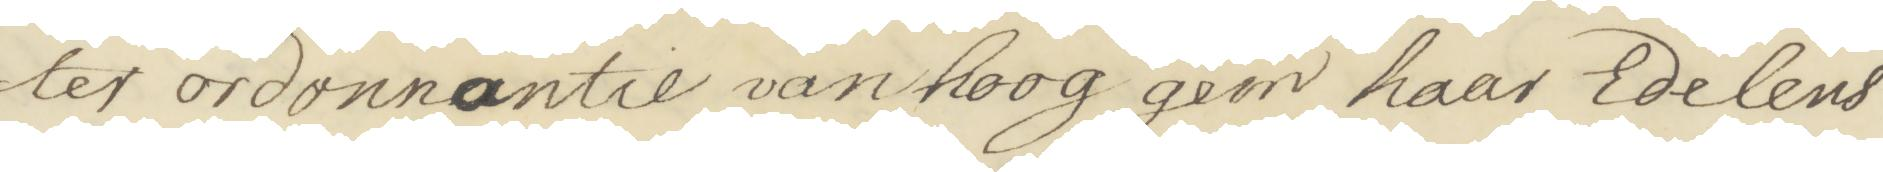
ter ordonnantie van hoog gem haar Edelens
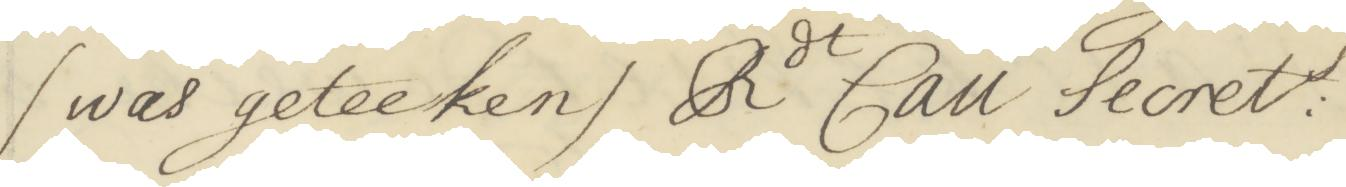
/was geteeken/ R:dt Cau Secret:s
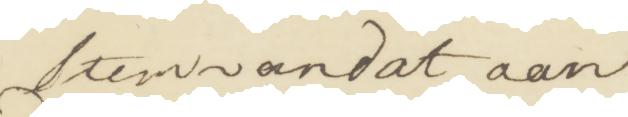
Item van dat aan
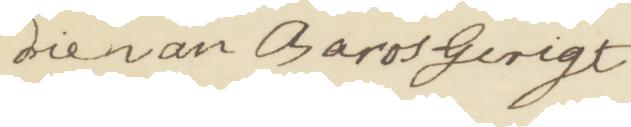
dien van Baros Gerigt
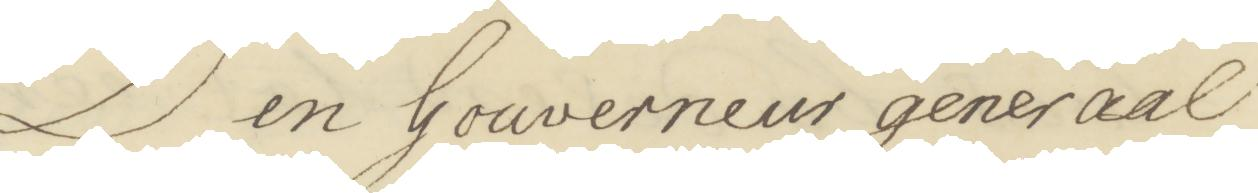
Den Gouverneur generaal
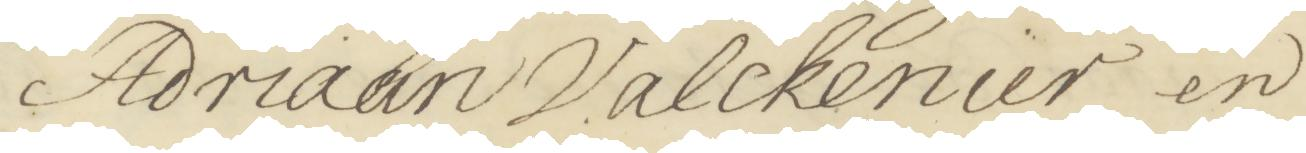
Adriaan Valckenier en
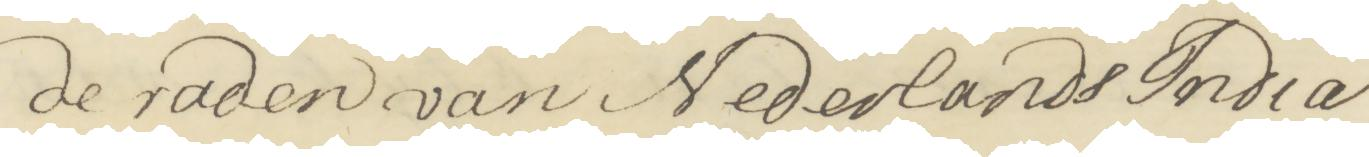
de raden van Nederlands India
